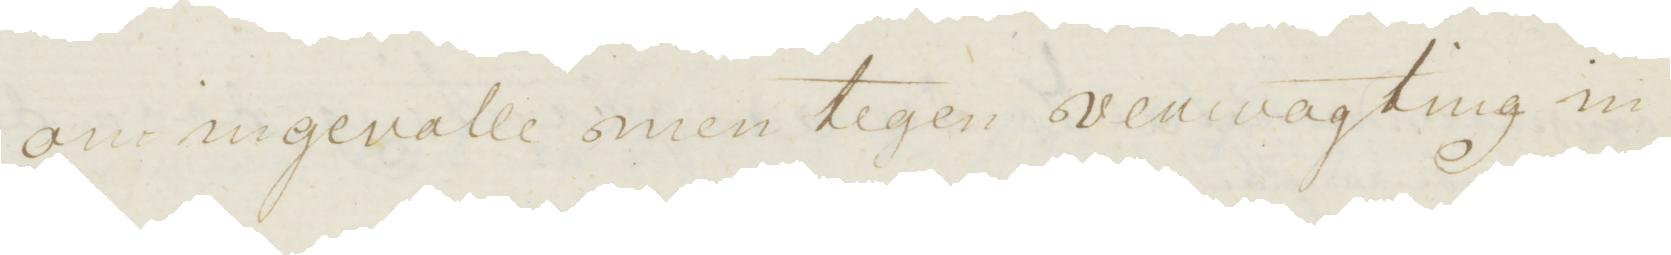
om ingevalle men tegen verwagting in
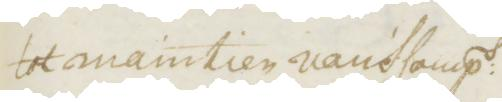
tot maintien van ’sComp:s
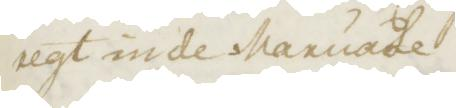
regt in de Maruase
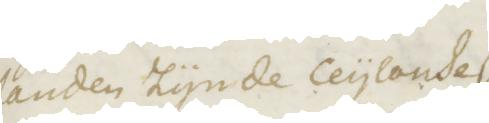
landen zijn de Ceijlonse
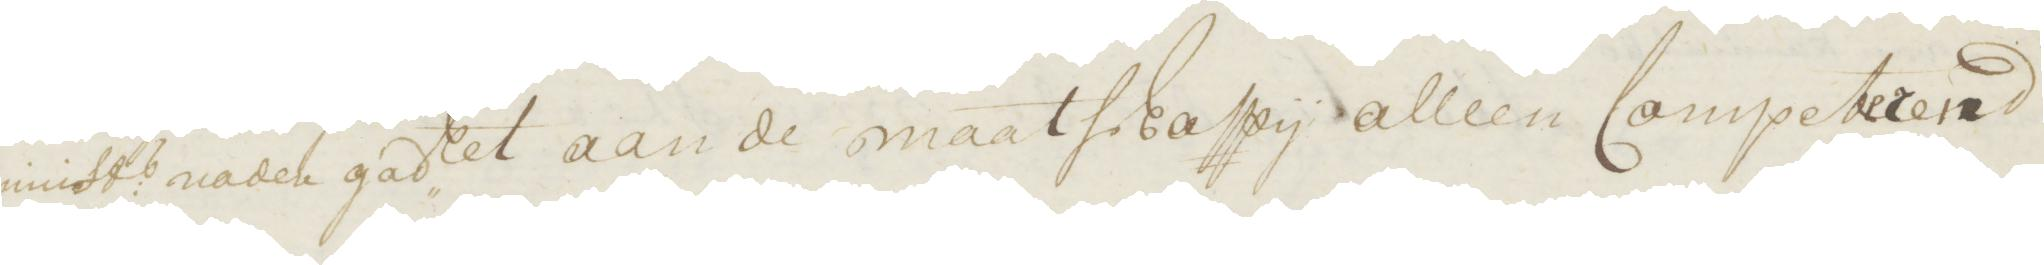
minist:s raden gad„ het aan de maatschappij alleen Competerend
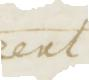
honteert
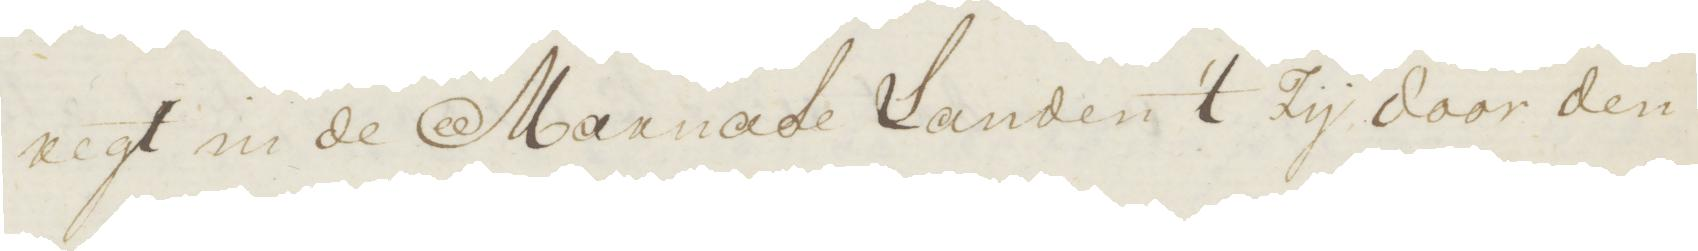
regt in de Maruase landen ’t zij door den
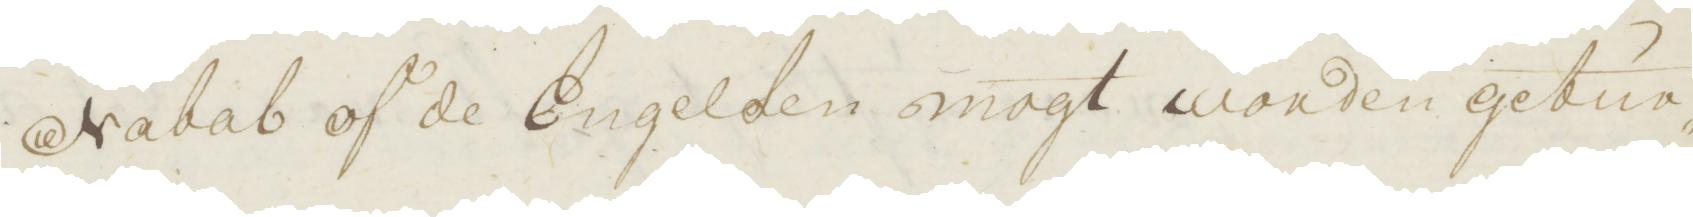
Nabab of de Engelsen mogt worden getur„
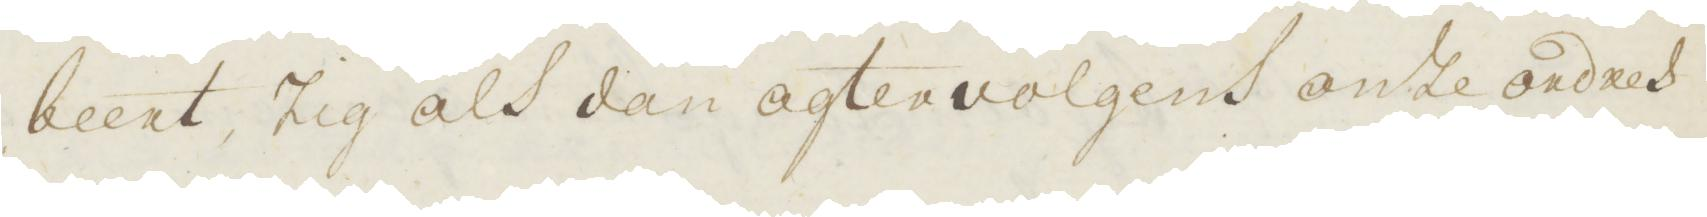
„beert, zig als dan agtervolgens onze ordres
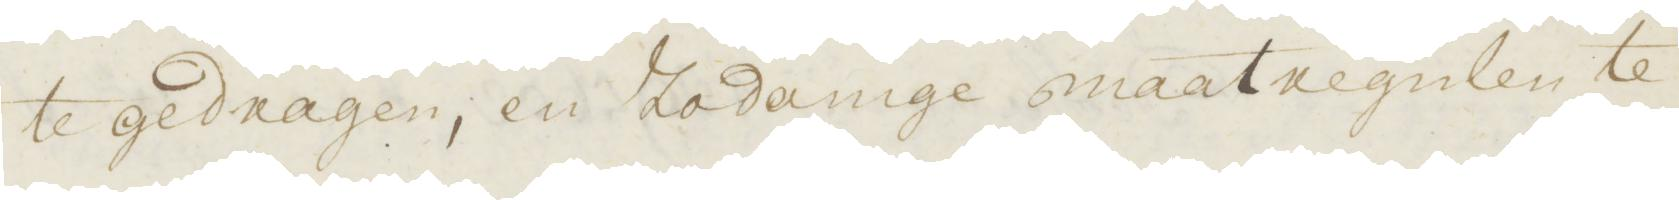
te gedragen en zodanige maatregulen te
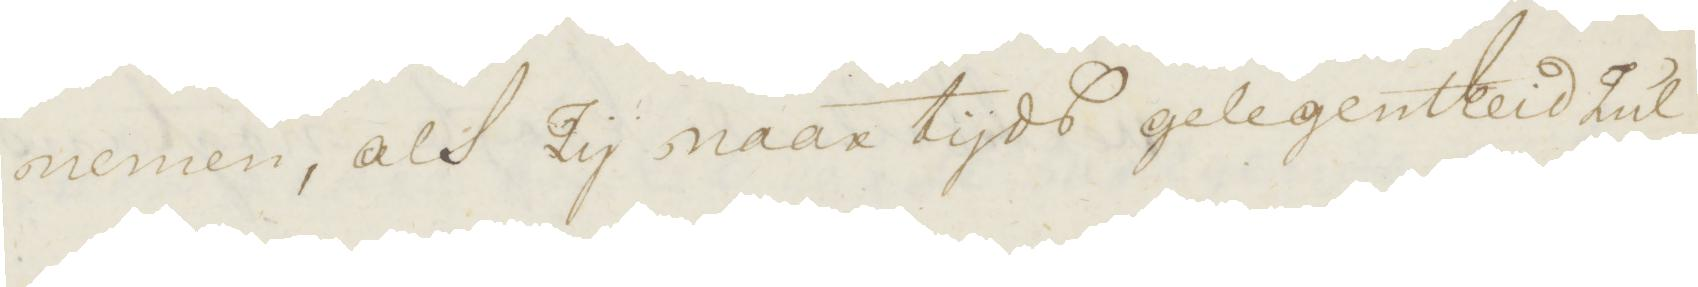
nemen, als zij naar tijds gelegentheid zul
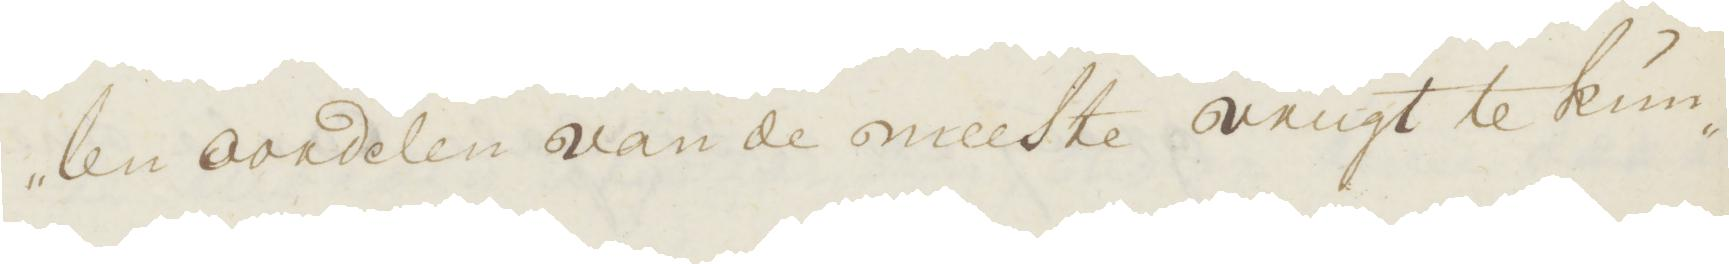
„len oordelen van de meeste vrugt te kun„
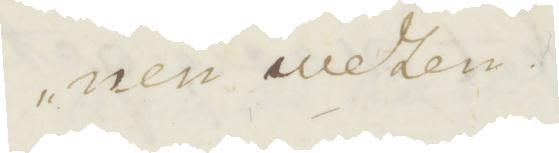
„nen wezen.
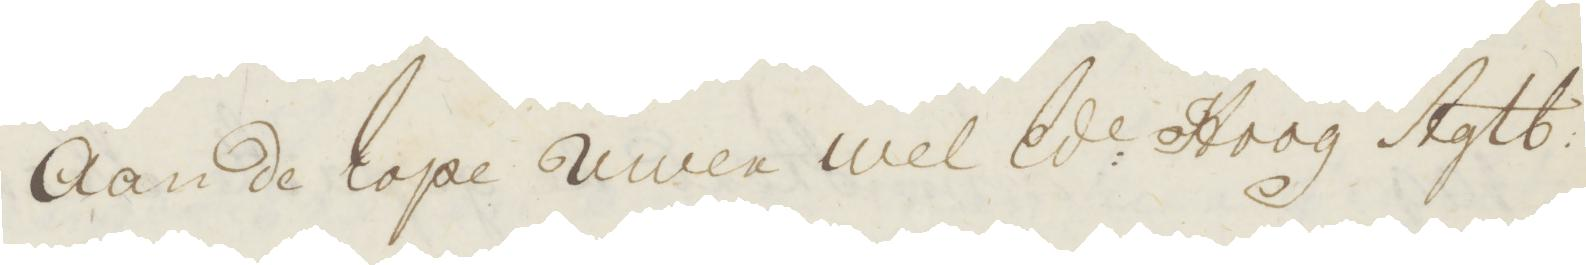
Aan de hope uwer wel Ed:e Hoog Agtb:
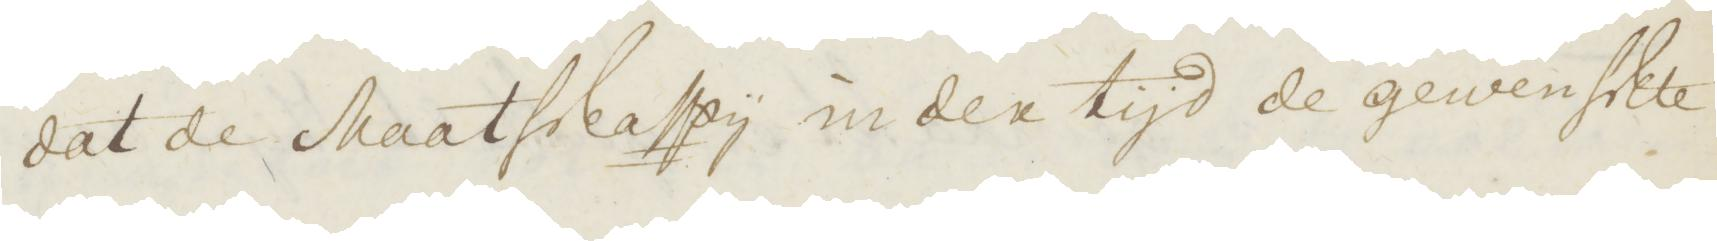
dat de maatschappij in der tijd de gewenschte
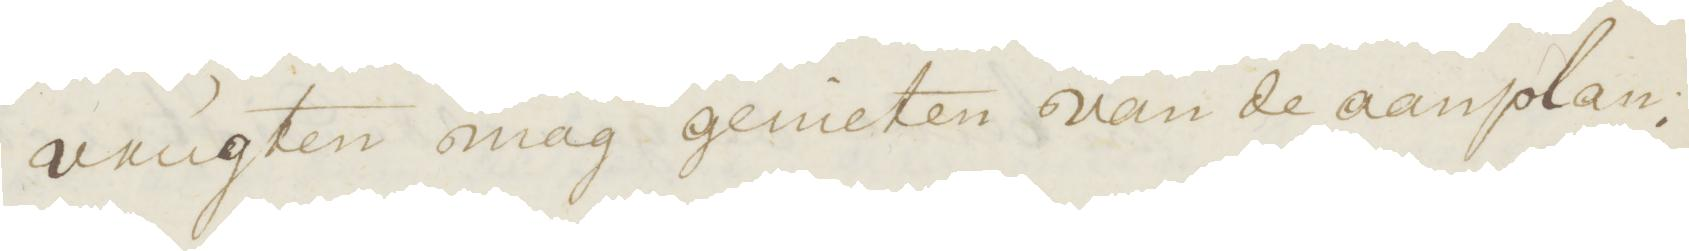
vrugten mag genieten van de aanplan:
